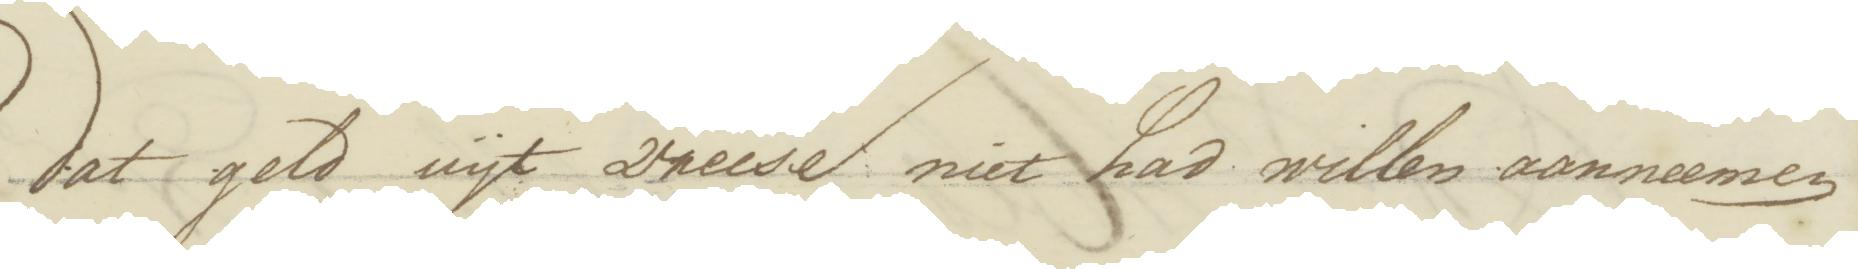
dat geld uijt vreese niet had willen aanneemen
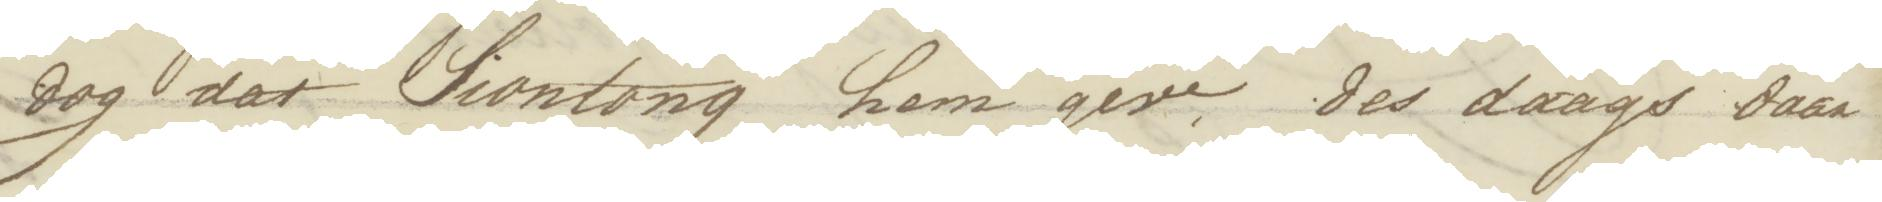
dog dat Siontong hem geve des daags daar
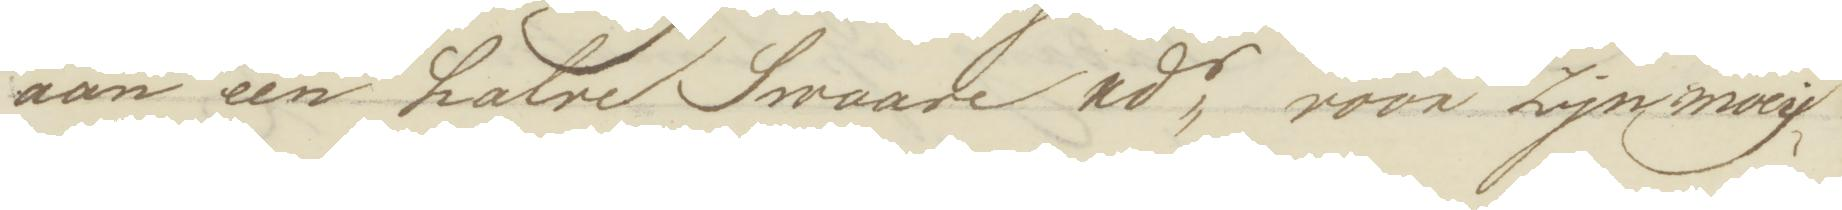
aan een halve swaare rd„s voor zijn moeij,
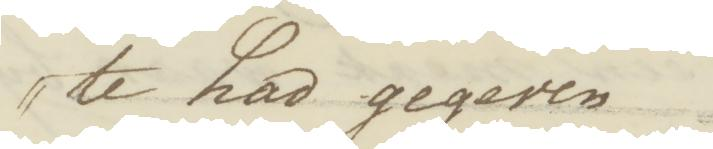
„te had gegeven
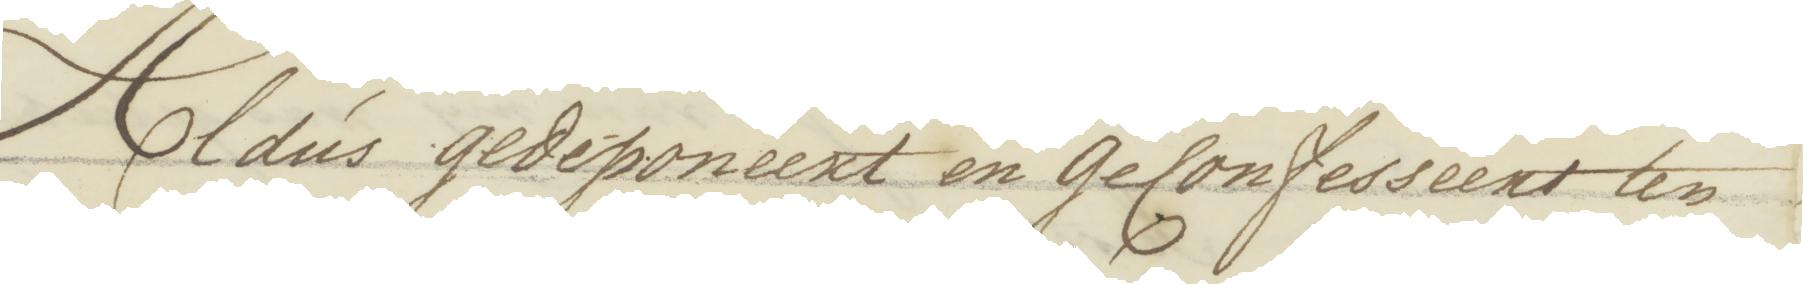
Aldus gedeponeert en geconfesseert ten
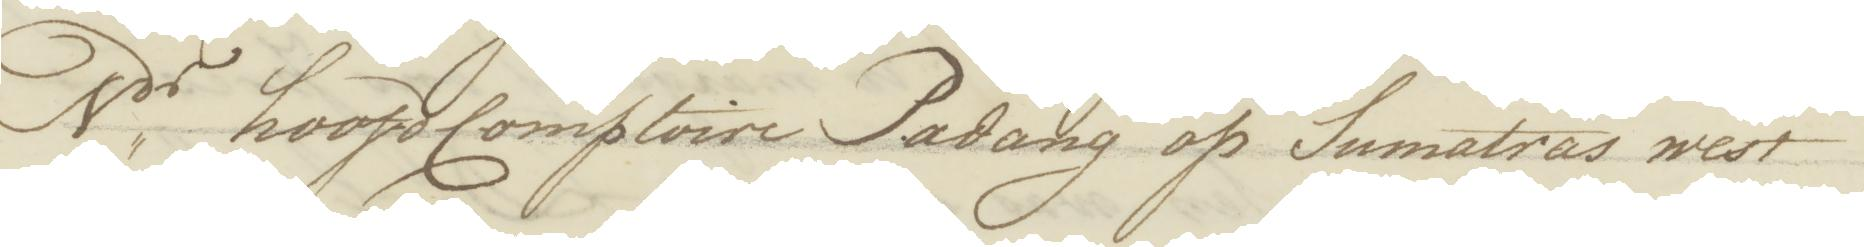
N„dr hoofdcomptoire Padang op Sumatras west
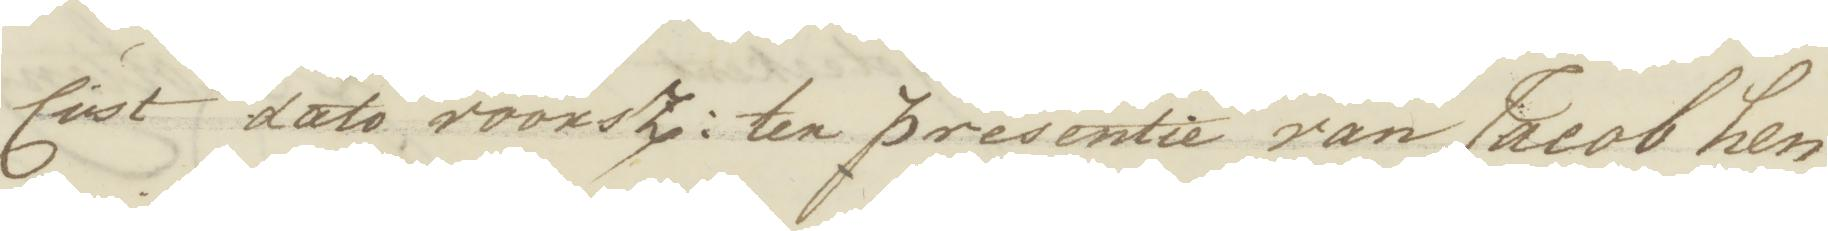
cust dato voorsz: ter presentie van Jacob hen
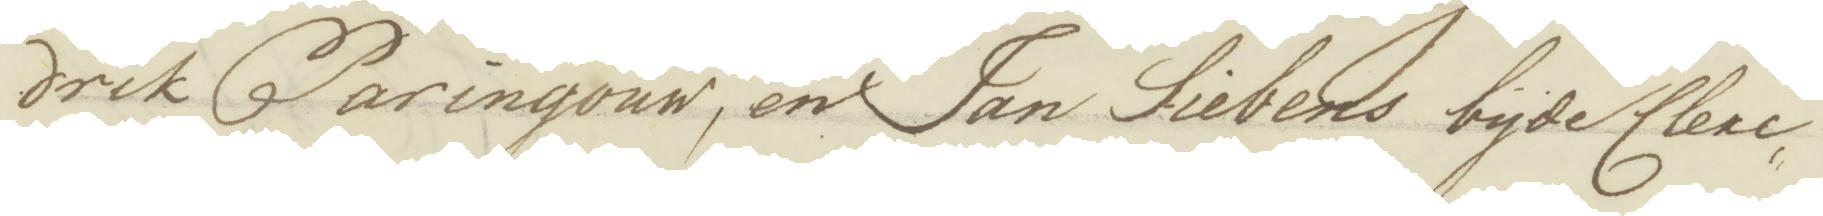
drik Paringouw, en Jan siebens bijde Clerc„
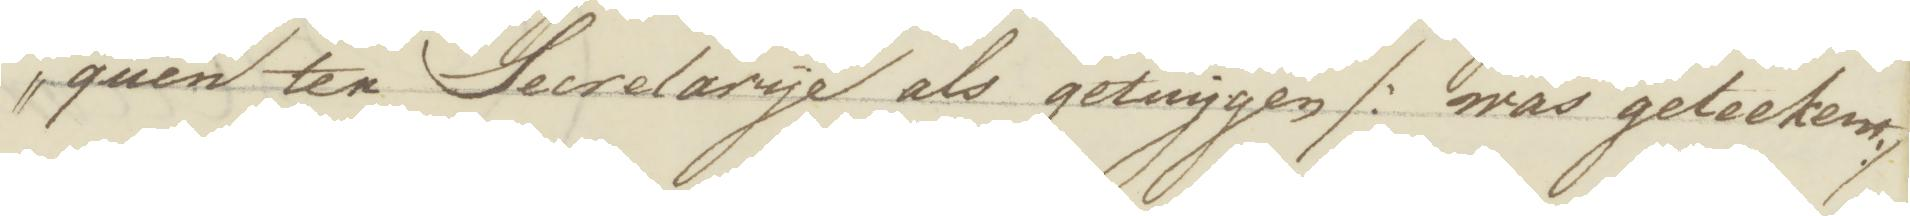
„quen ter secretarije als getuijgen /:was geteekent:/
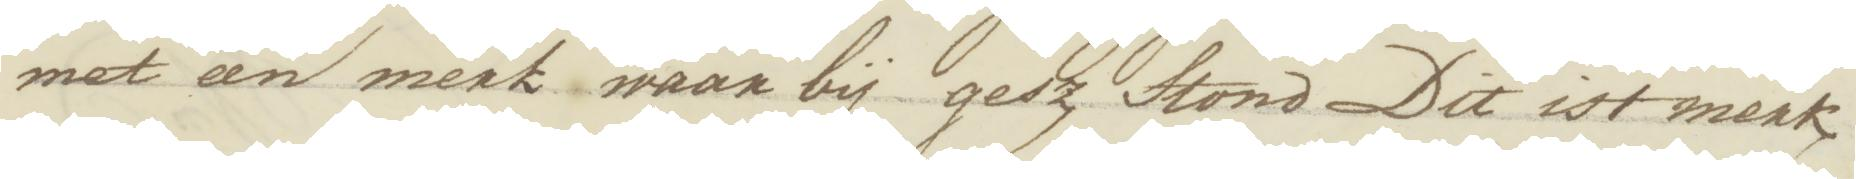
met een merk waar bij gesz stond Dit ist merk
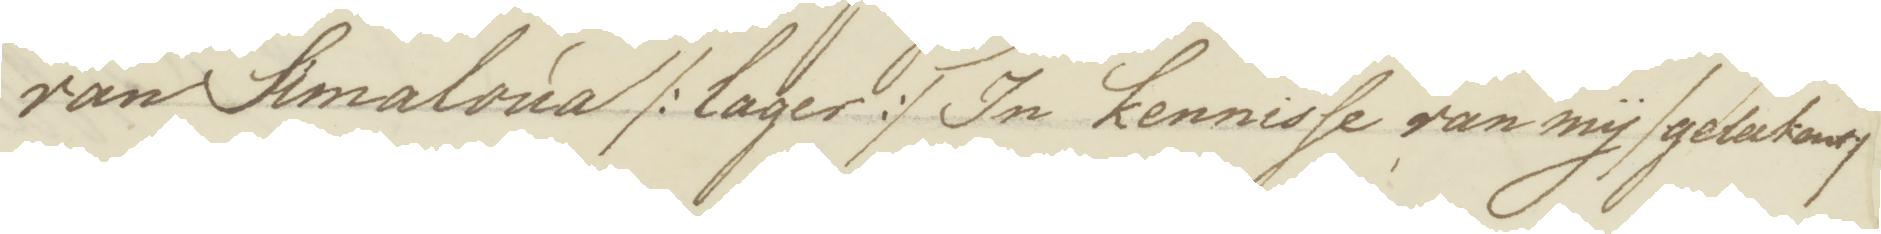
van Simaloua /:lager:/ In kennisse van mij /:geteekent:/
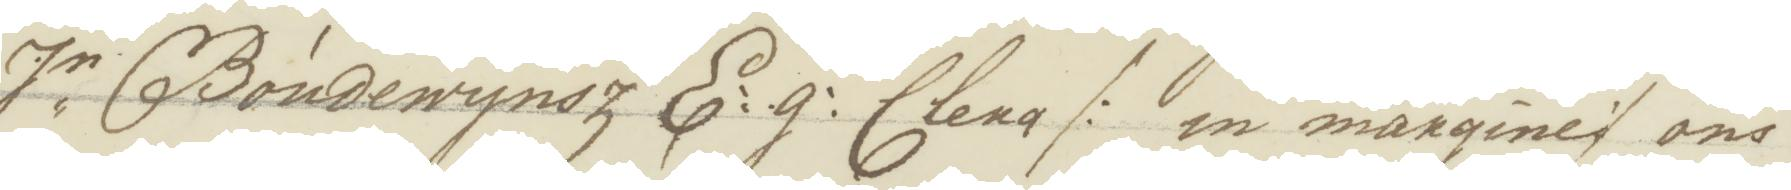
J„n Boudewijnsz E: g: Clerq /: in margine:/ ons
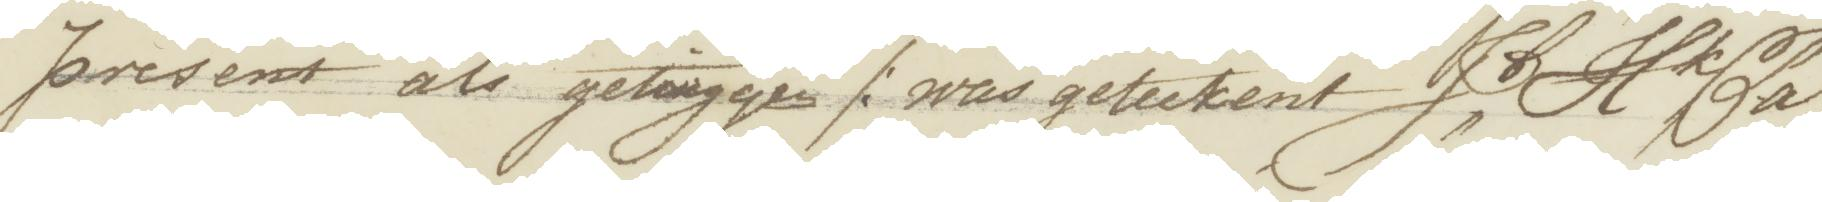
present als getuijgen /:was geteekent J„b Hk Pa„
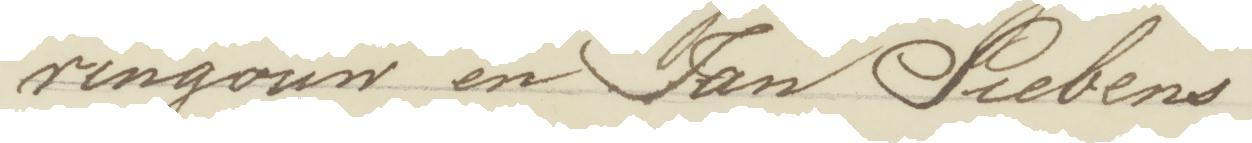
ringouw en Ian Siebens
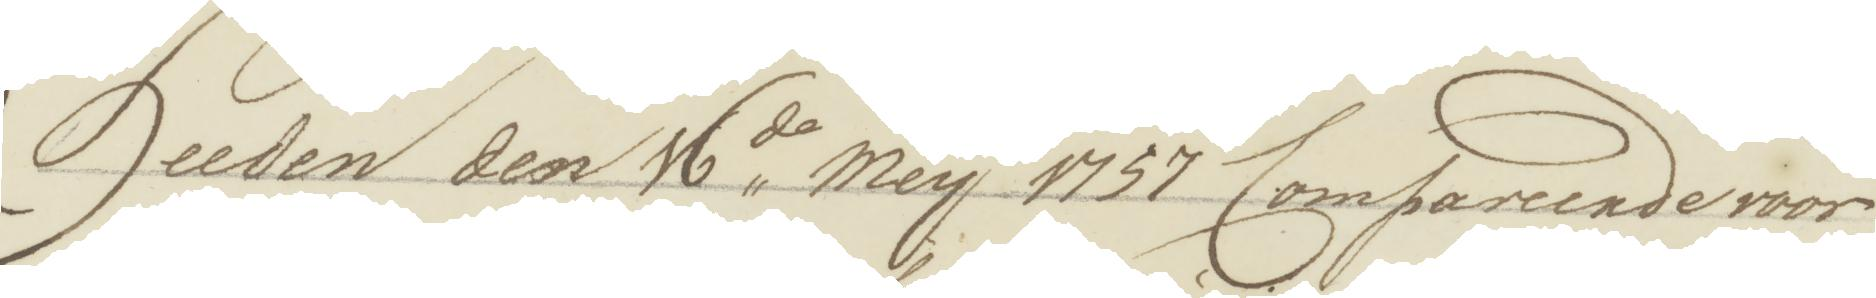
Heeden den 16„de meij 1721 compareerde voor
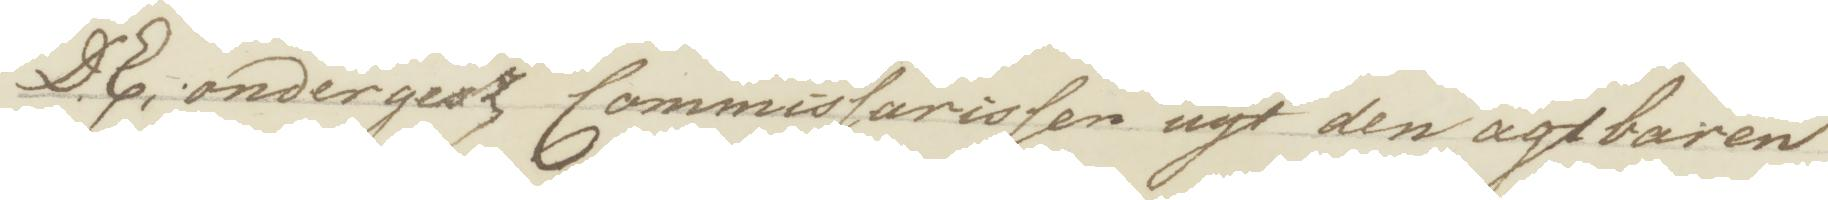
D. E., ondergesz commissarissen uijt den agtbaren
